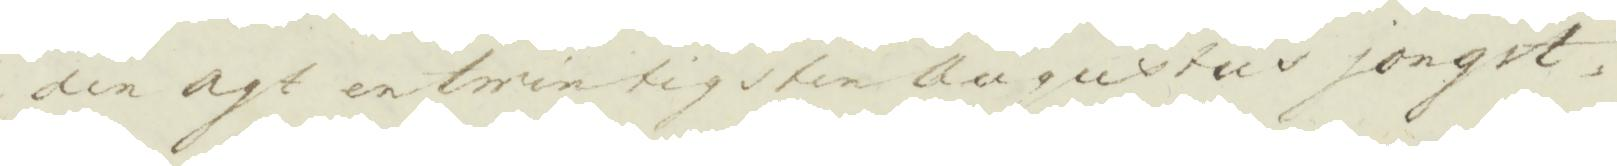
den agt en twintigsten augustus jongst„
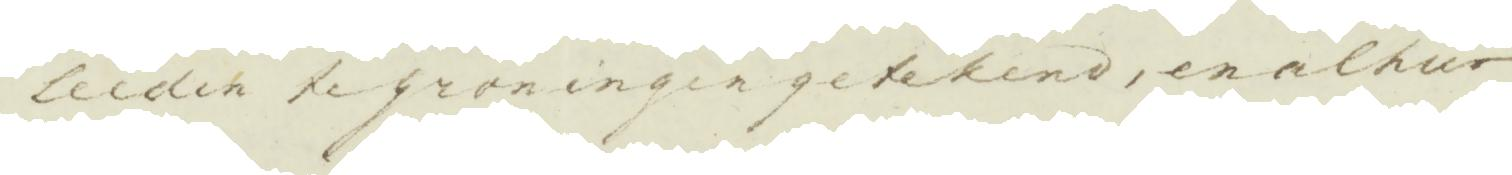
leeden te groningen getekend, en alhier
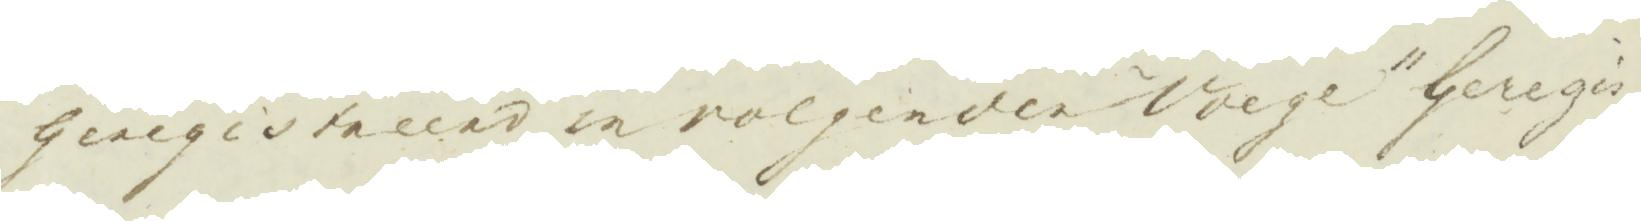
Geregistreerd in volgende Voege "Geregis
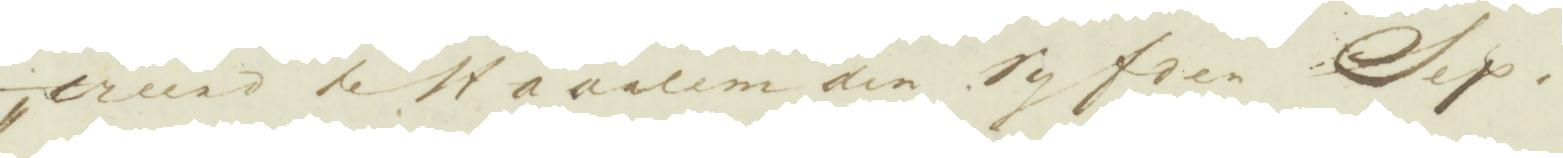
„treerd te Haarlem den vyfden Sep„
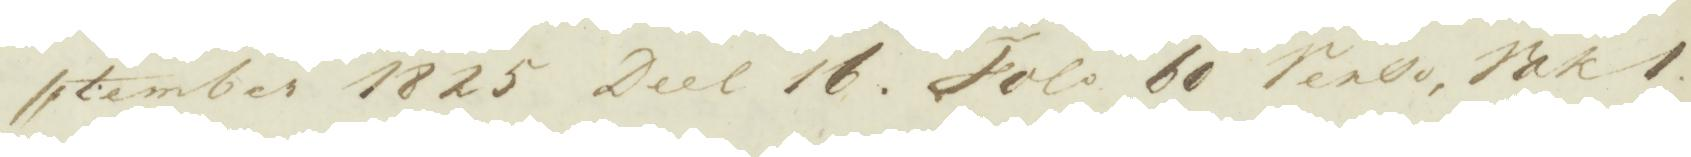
„tember 1825 Deel 16. Fol.o 60 Verso, Vak 1.
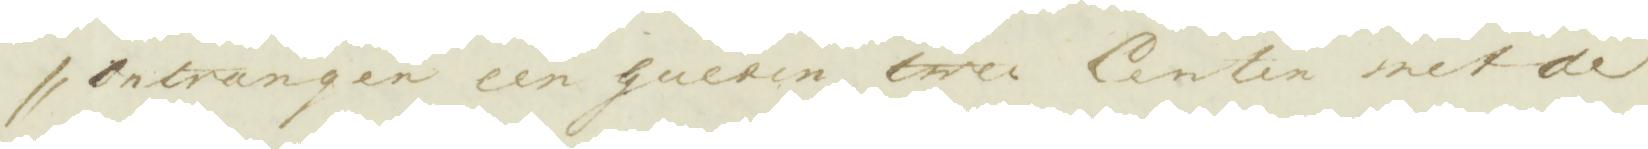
„ontvangen een gulden twee Centen met de
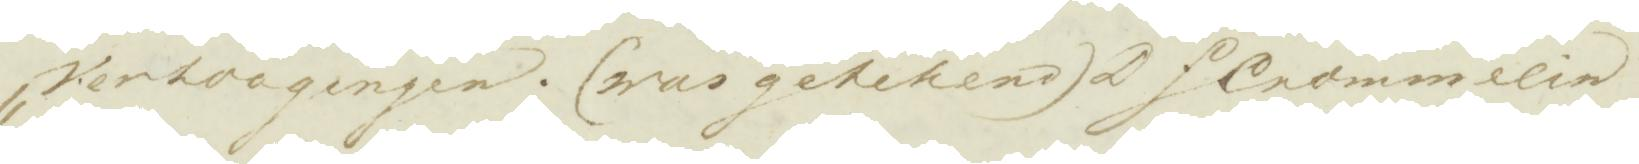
„verhoogingen. (was getekend) D f Crommelin"
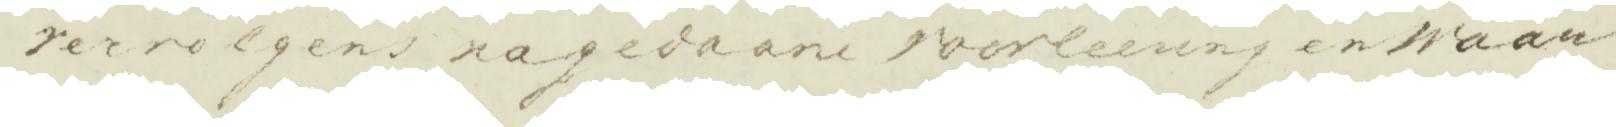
vervolgens nagedaane voorleezing en waar
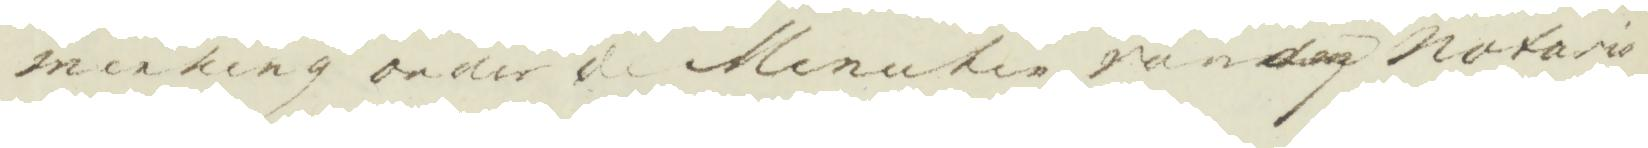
merking onder de Minuten van den Notaris
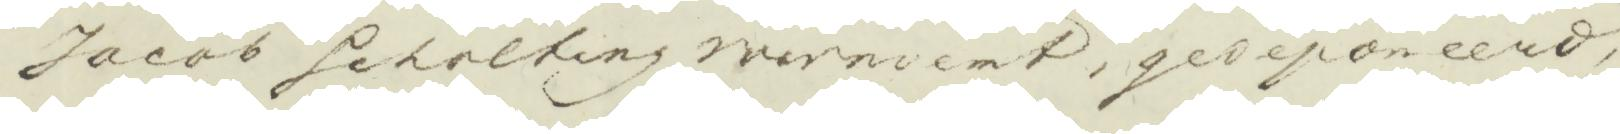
Jacob Scholting voornoemt, gedeponeerd,
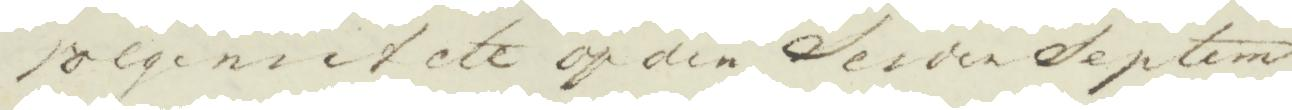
volgens Acte op den Seven Septem
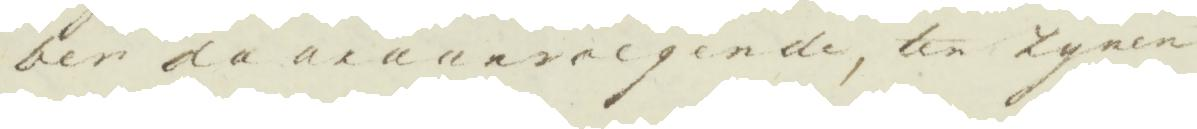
ber daaraanvolgende, ten zynen
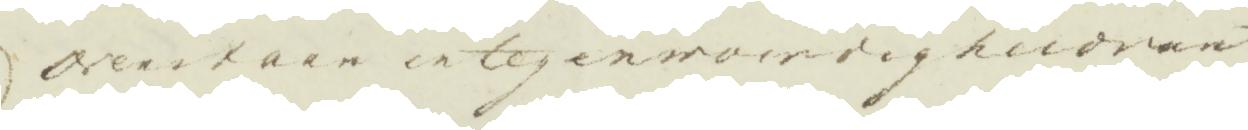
overstaan in tegenwoordigheid van
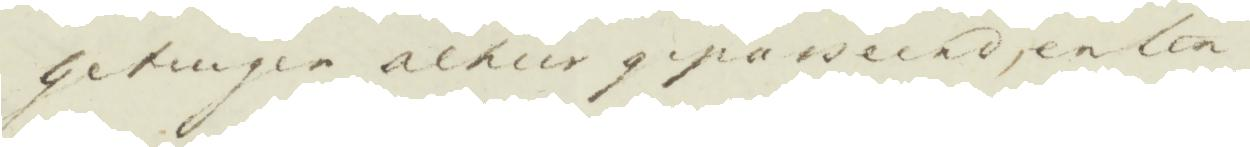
getuigen alhier gepasseerd, en ten
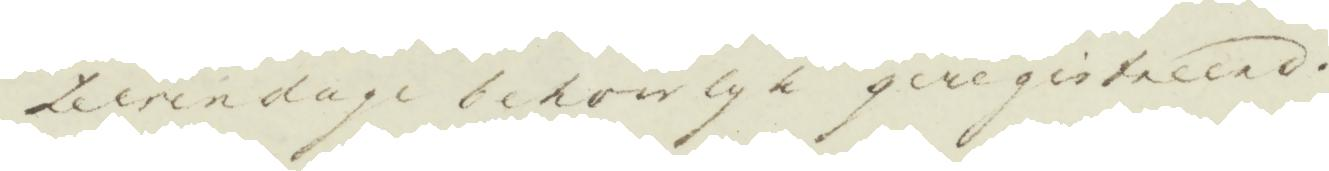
zelven dage behoorlyk geregistreerd.
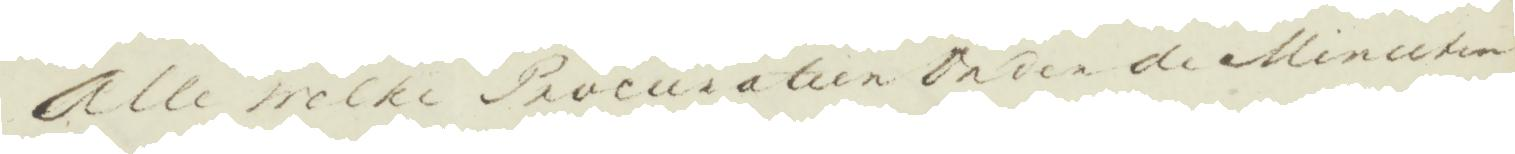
alle welke Procuratien onder de Minuten
